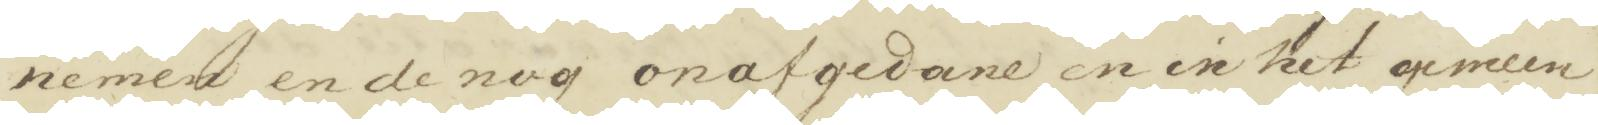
nemen en de nog onafgedane en in het gemeen
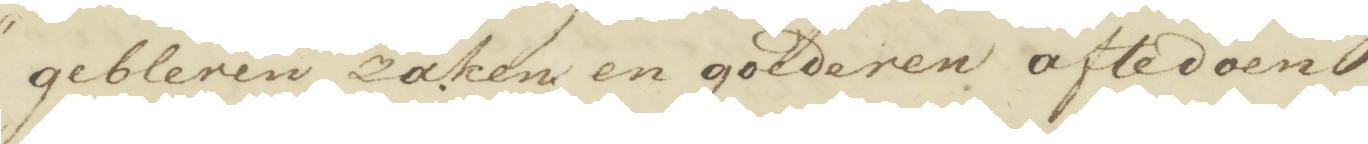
gebleven zaken en goederen aftedoen
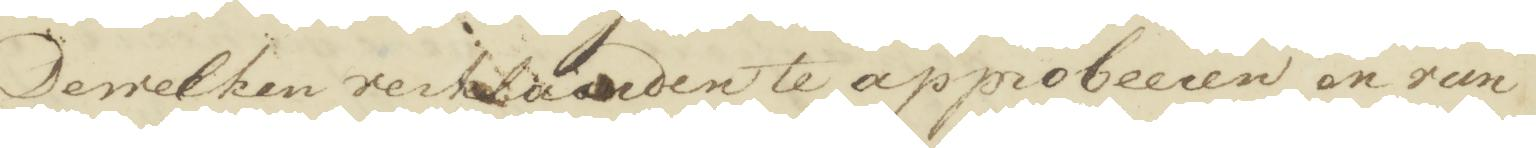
Dewelken verklaarden te approbeeren en van
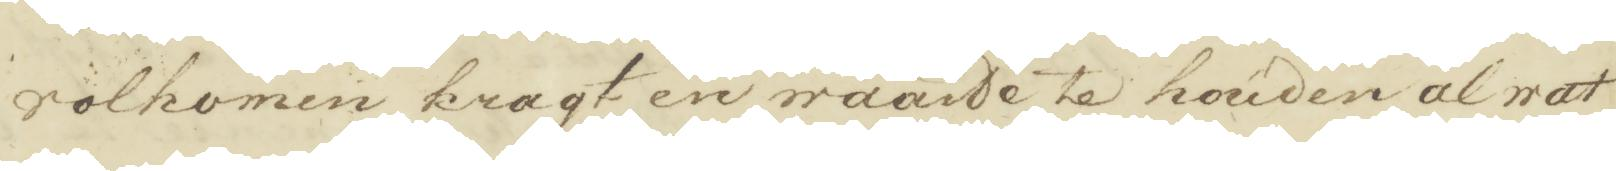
volkomen kragt en waarde te houden al wat
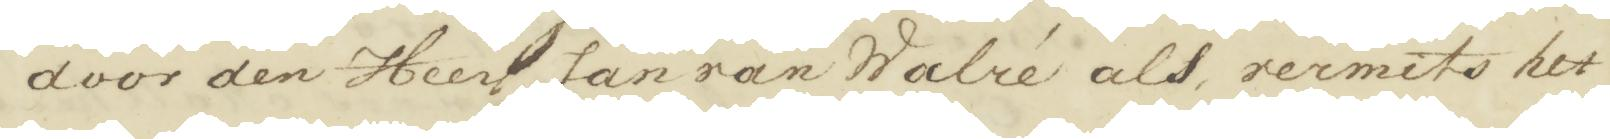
door den Heer Jan van Walré als, vermits het
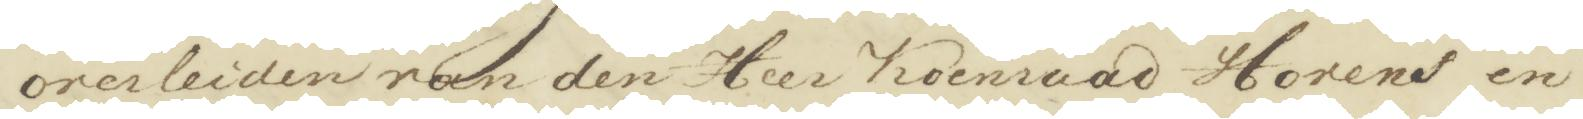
overleiden van den Heer Koenraad Hovens en
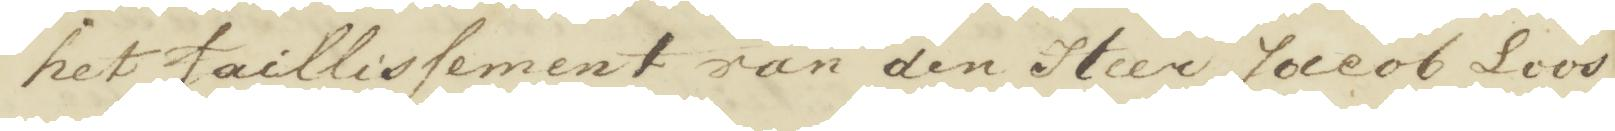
het faillissement van den Heer Jacob Loos
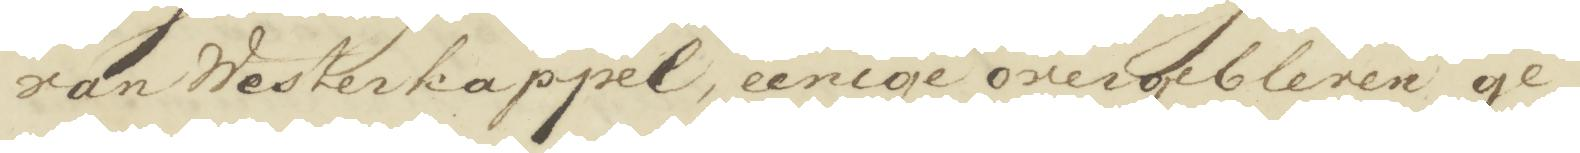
van Westerkappel, eenige overgebleven ge
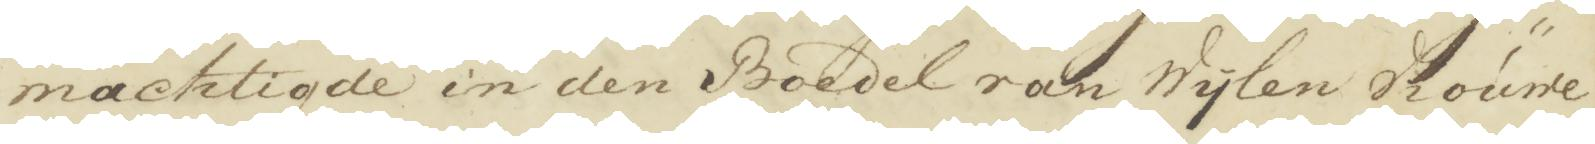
machtigde in den Boedel van Wijlen Vrouwe
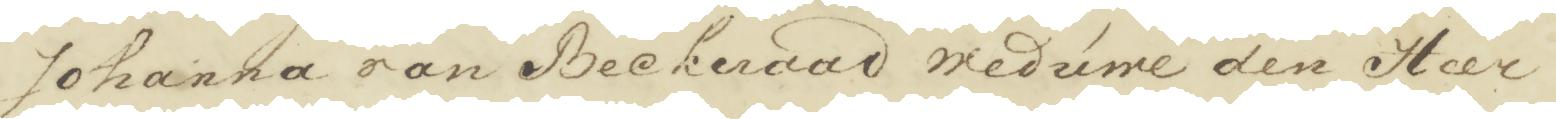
Johanna van Beckeraad weduwe den Heer
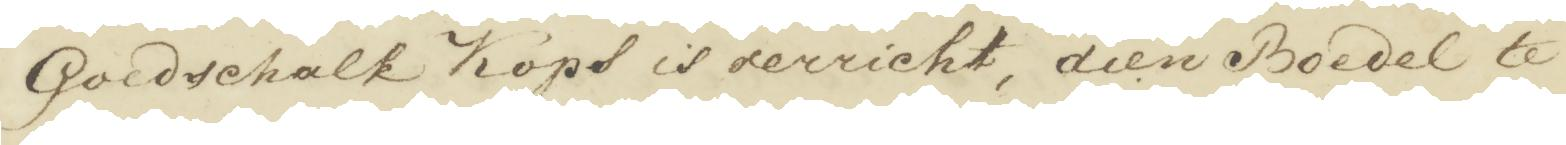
Goedschalk Kops is verricht, dien Boedel te
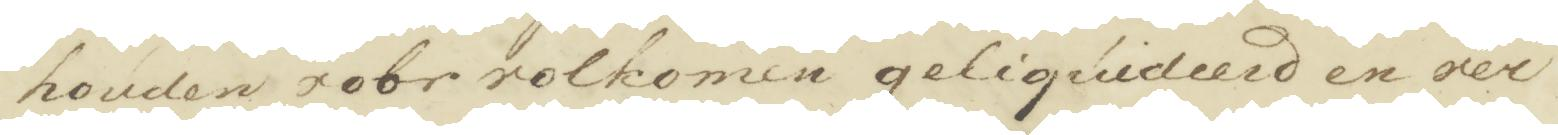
houden voor volkomen geliquideerd en ver
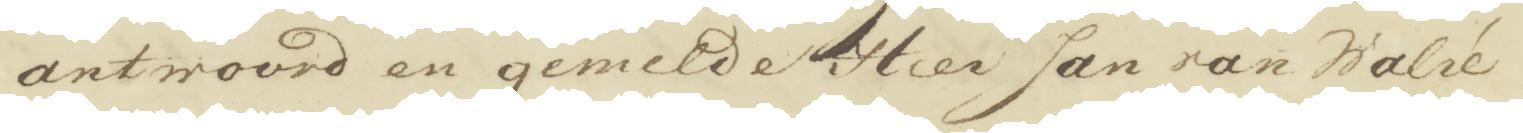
antwoord en gemelde Heer Jan van Walré
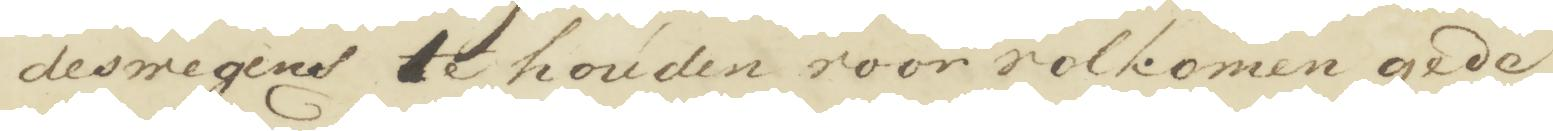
deswegens te houden voor volkomen gede,
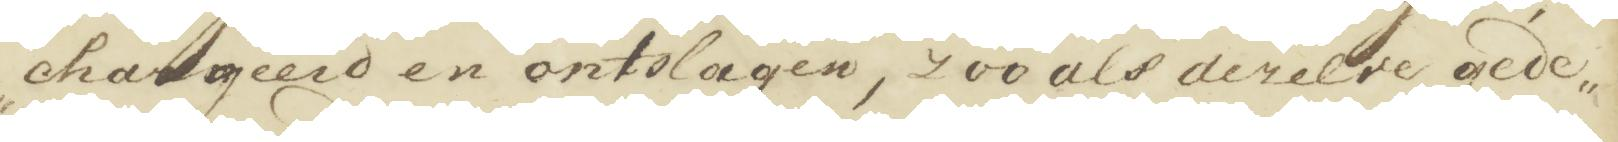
chargeerd en ontslagen, zoo als dezelve gede„
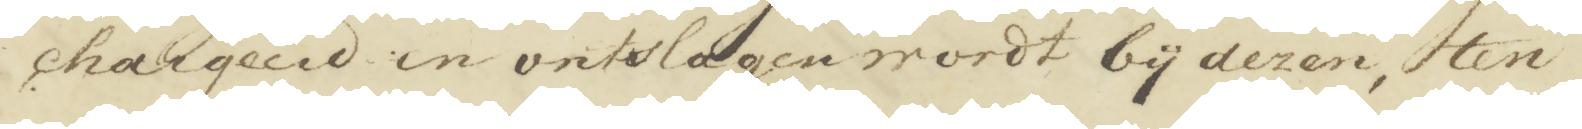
„chargeerd en ontslagen wordt bij dezen, ten
